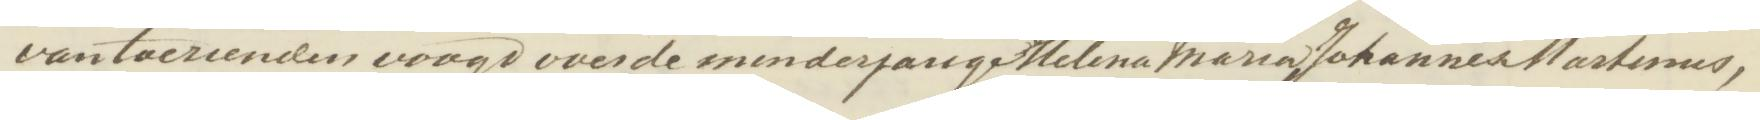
van toezienden voogd over de minderjarige Helena Maria Johannes Martinus,
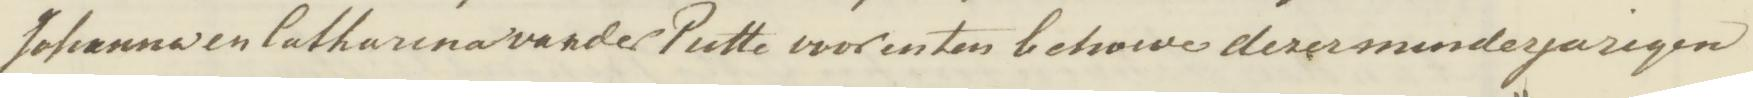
Johanna en Catharina vander Putte voor en ten behoeve dezer minderjarigen
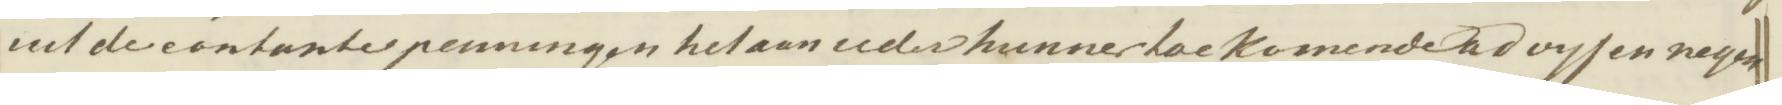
uit de contante penningen het aan ieder hunner toe komende ad vyf en negen
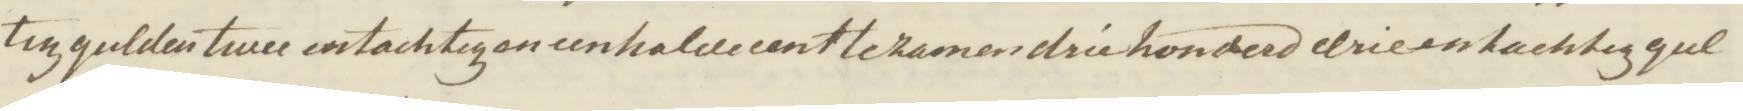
tig gulden twee en tachtig en een halve cent tezamen drie honderd drie en tachtig gul
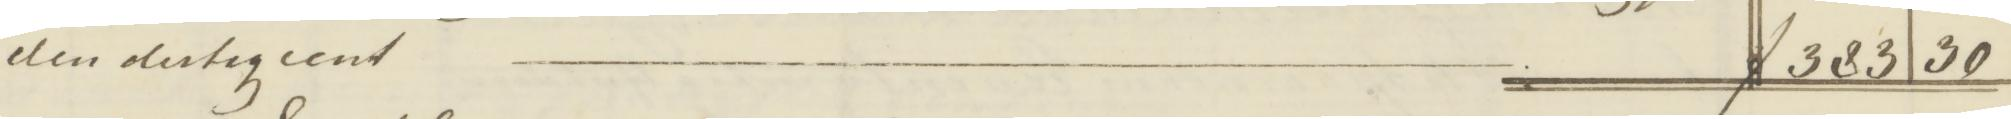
den dertig cent ƒ 383 30
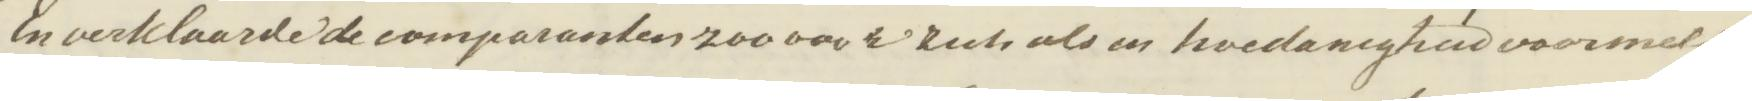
En verklaarde de comparanten zoo voor zich als in hoedanigheid voormeld
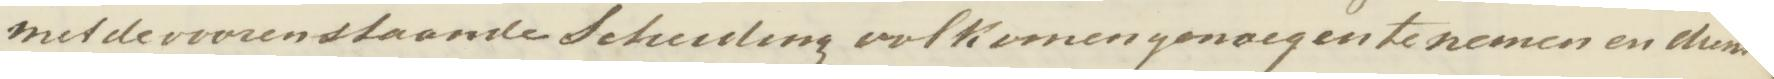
met de voorenstaande scheiding volkomen genoegen te nemen en diens
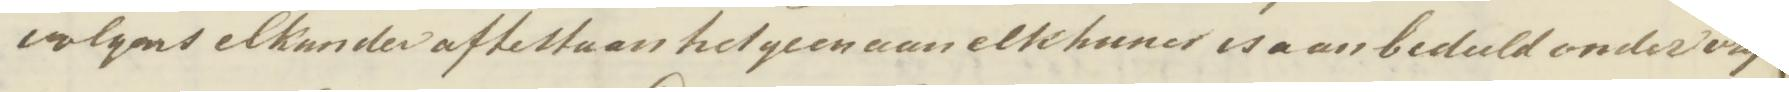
volgens elkander aftestaan hetgeen aan elk huner is aan bedeeld onder vry
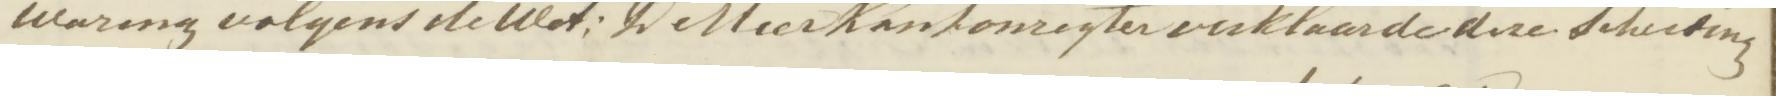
waring volgens de Wet; De Heer Kantonregter verklaarde deze scheiding
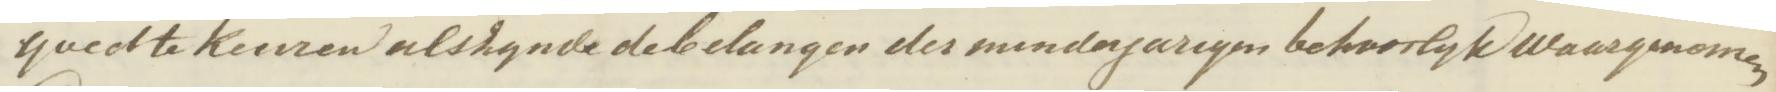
goed te keuren als zynde de belangen des minderjarigen behoorlijk waargenomen
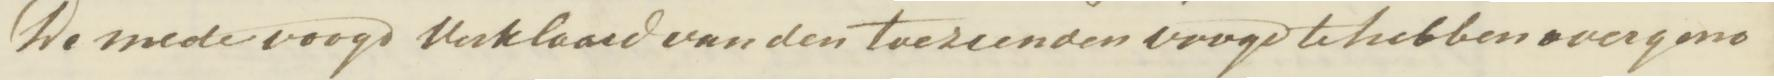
De mede voogd verklaard van den toezienden voogd te hebben overgeno
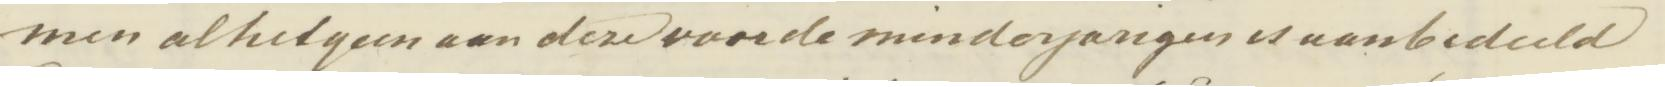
men al hetgeen aan deze voor de minderjarigen is aanbedeeld
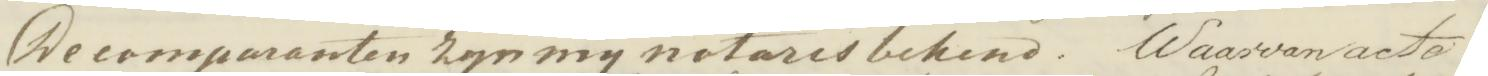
De comparanten zyn my notaris bekend. Waarvan acte.
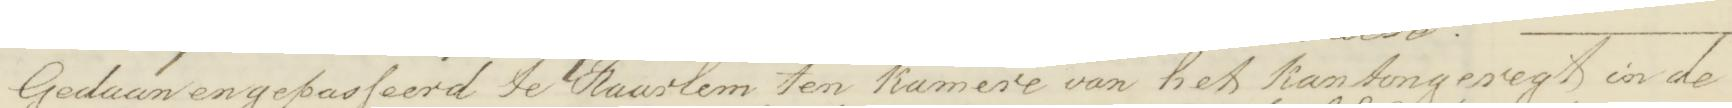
Gedaan en gepasseerd te Haarlem ten kamere van het kantongeregt in de
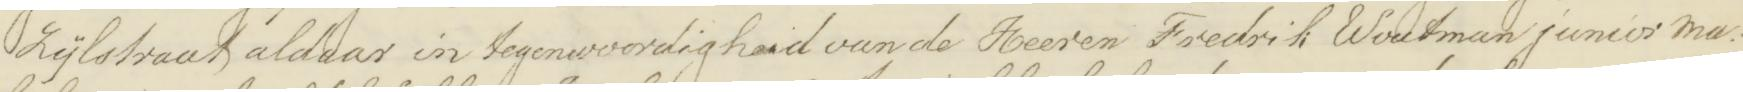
Zijlstraat aldaar in tegenwoordigheid van de Heeren Fredrik Woutman junior ma
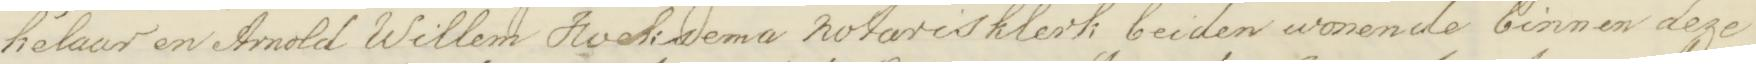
kelaar en Arnold Willem Hoeksema notaris klerk beiden wonende binnen deze
